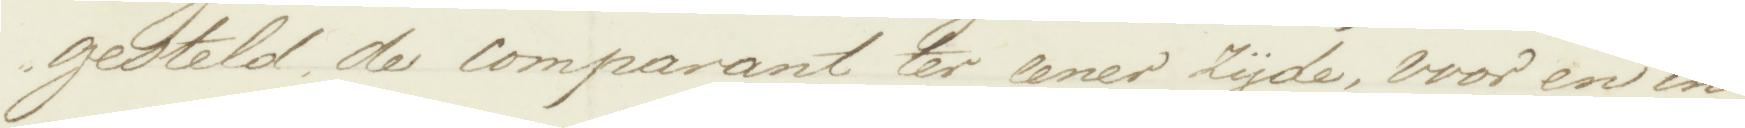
„gesteld, de comparant ter eener zijde, voor en in
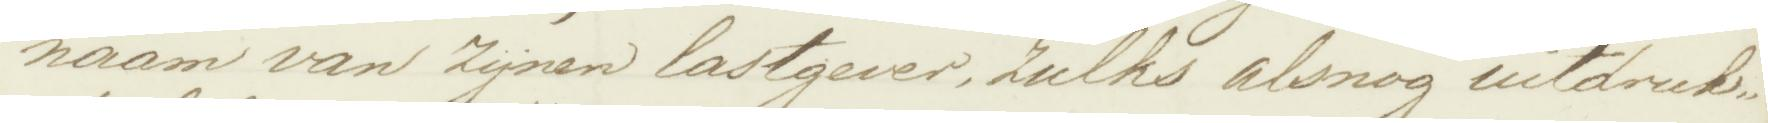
naam van zijnen lastgever, zulks als nog uitdruk„
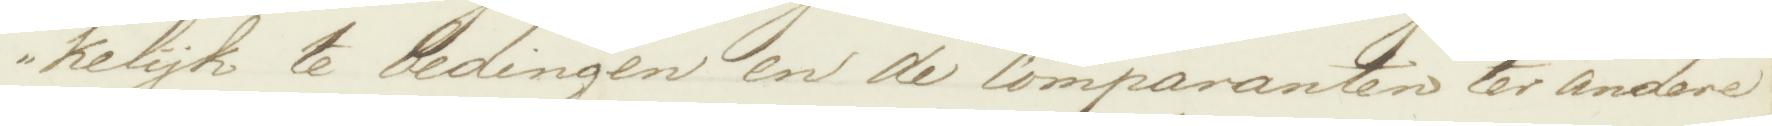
„kelijk te bedingen en de comparanten ter andere
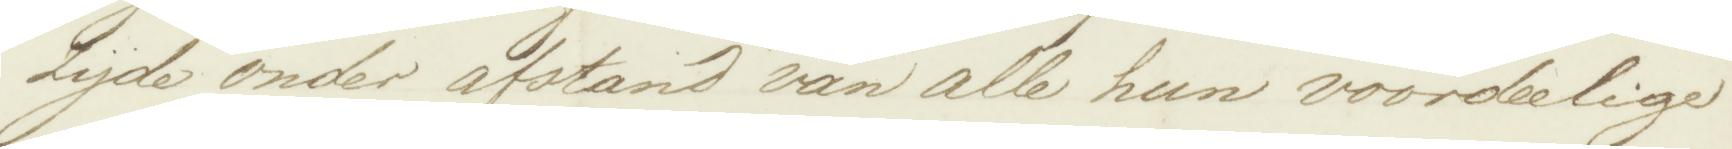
zijde onder afstand van alle hun voordeelige
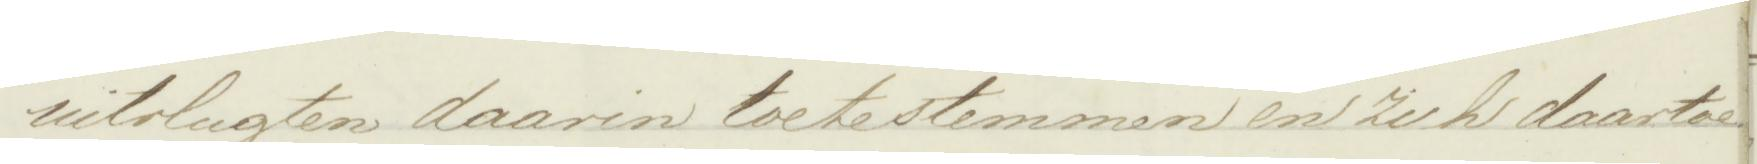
uitvlugten daarin toetestemmen en zich daartoe
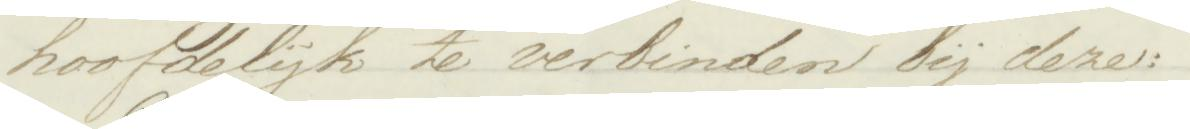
hoofdelijk te verbinden bij deze:
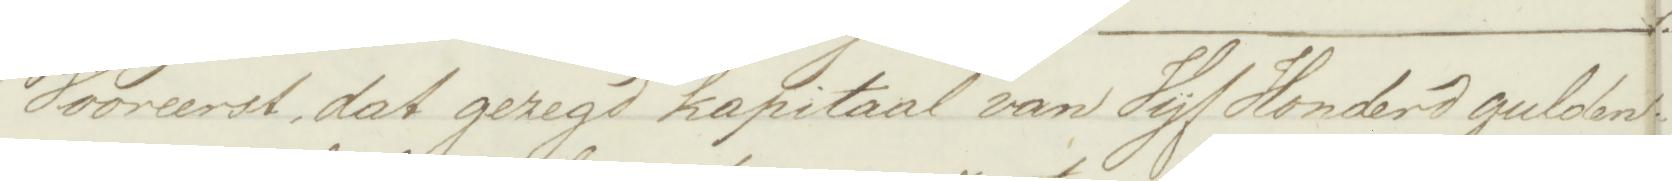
Vooreerst, dat gezegd kapitaal van Vijf Honderd gulden
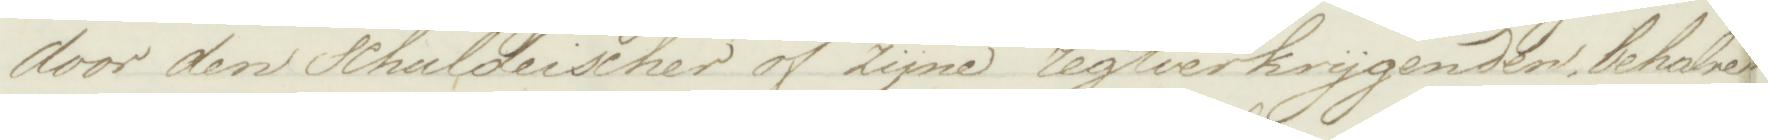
door den schuldeischer of zijne regtverkrijgenden, behalve
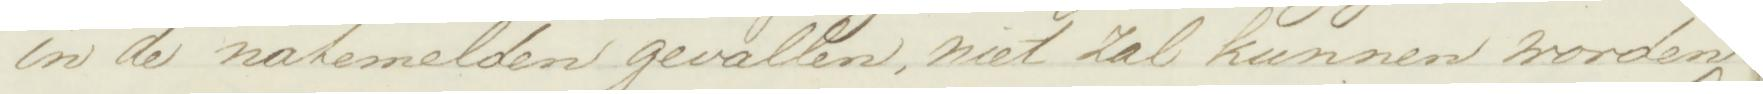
in de natemelden gevallen, niet zal kunnen worden
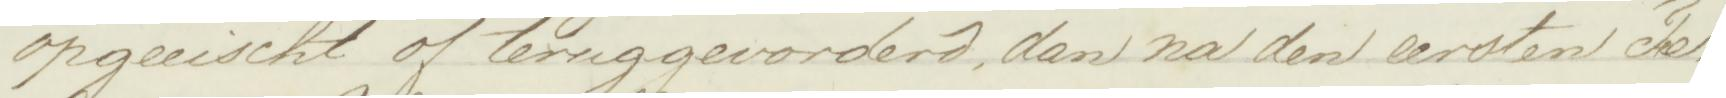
opgeeischt of teruggevorderd, dan na den eersten Fe
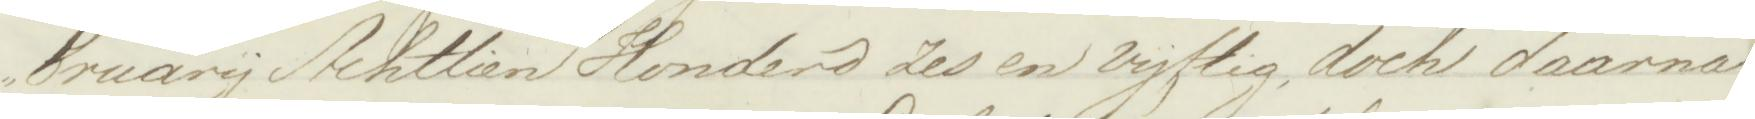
„bruarij Achttien Honderd zes en vijftig, doch daarna
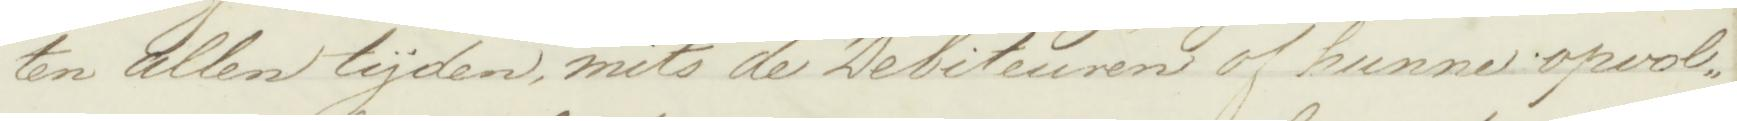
ten allen tijden, mits de Debiteuren of hunne opvol„
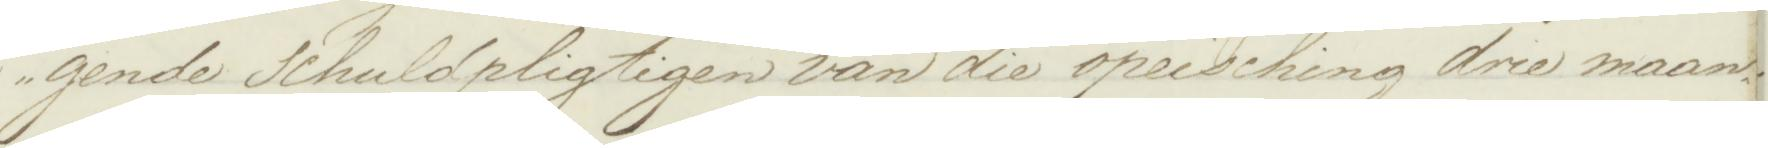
„gende schuldpligtigen van die opeisching drie maan„
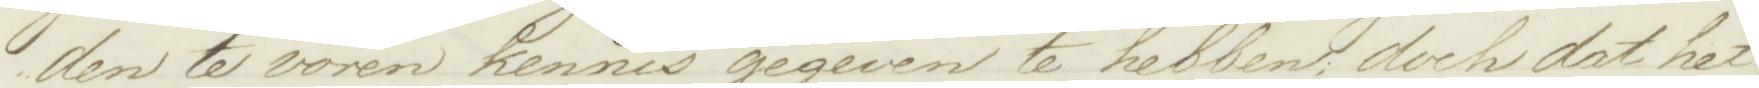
„den te voren kennis gegeven te hebben; doch dat het
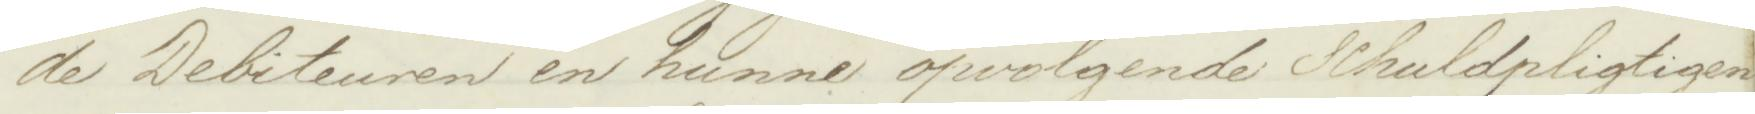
de Debiteuren en hunne opvolgende schuldpligtigen
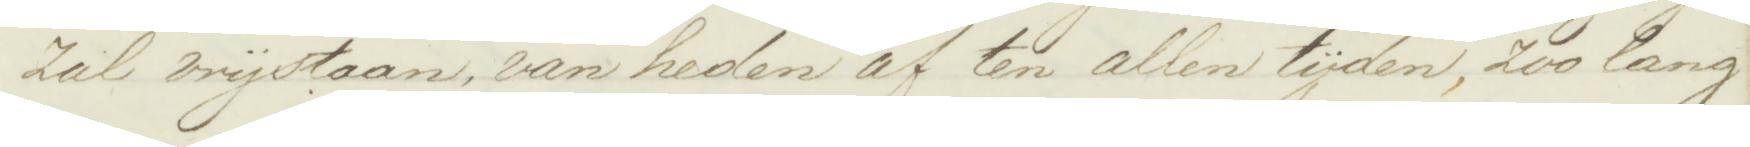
zal vrijstaan, van heden af ten allen tijden, zoo lang
